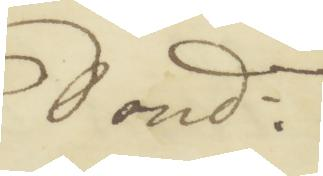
dond:
